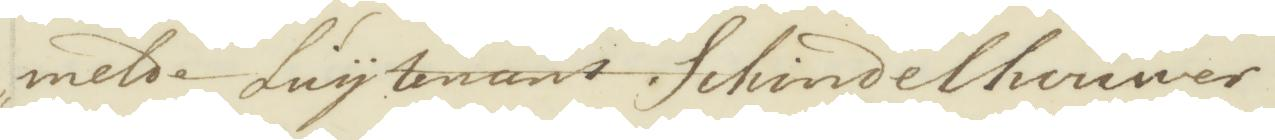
melde Luijtenant schindelhouwer
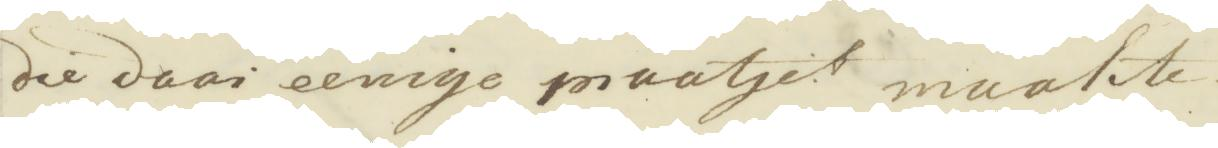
die daar eenige praatjes maakte
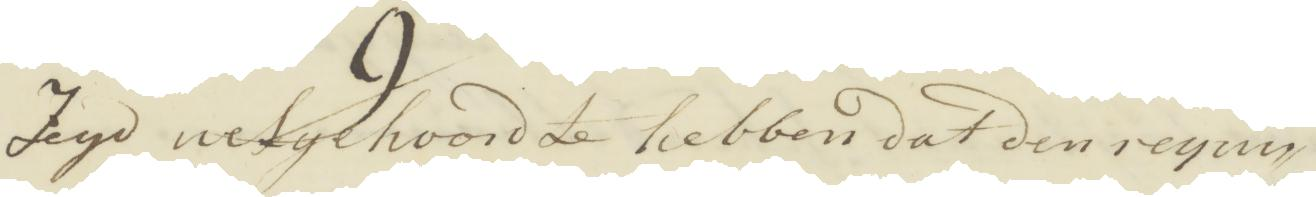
zeyd wel gehoord te hebben dat den requi„
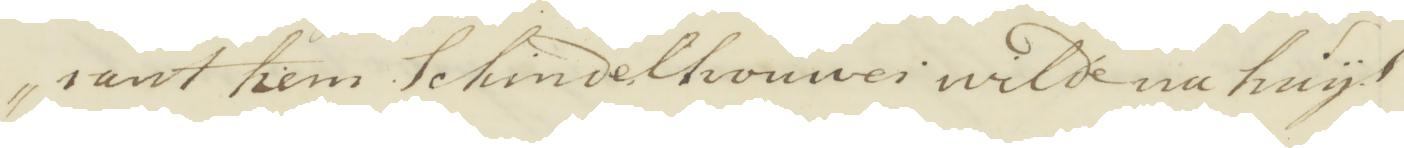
„ rant hem schindelhouwer wilde na huijs
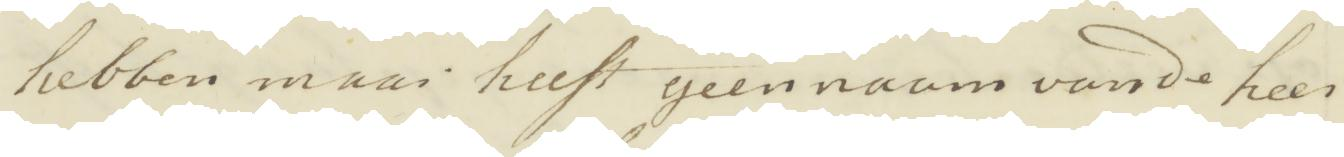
hebben maar heeft geen naam van de heer
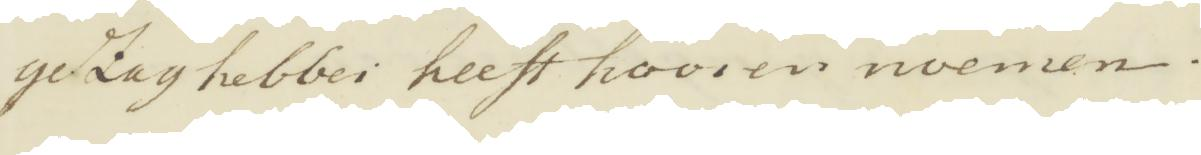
gezaghebber heeft hooren noemen.
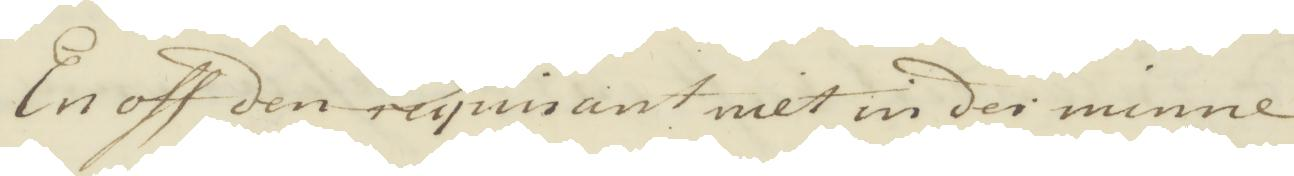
En off den requirant niet in der minne
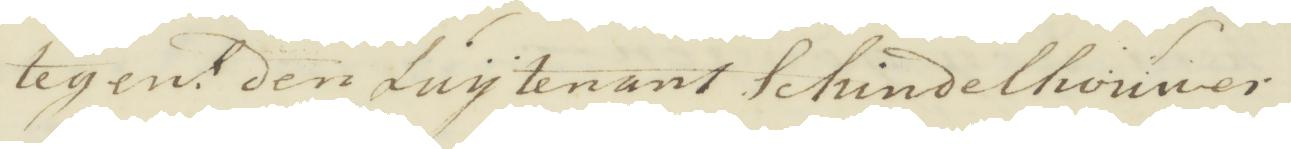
tegens den Luijtenant schindelhouwer
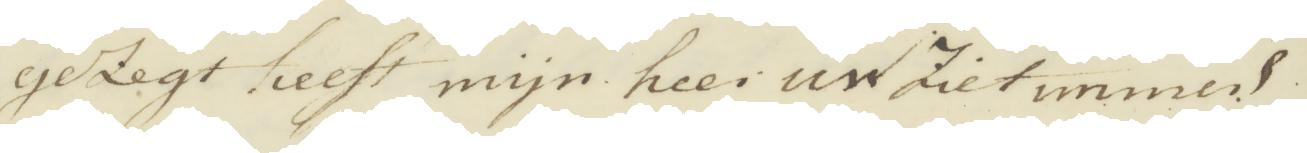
gezegt heeft mijn heer uw Ziet immers
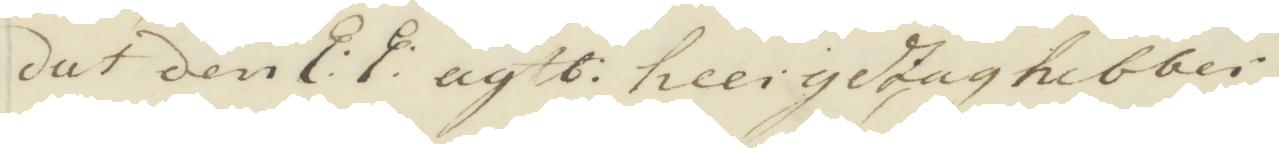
dat den E: E: agtb: heer gezaghebber
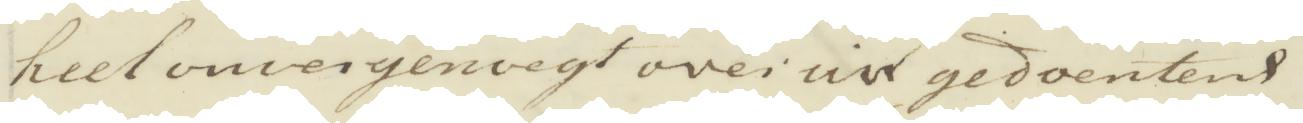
heel onvergenoegt over uw gedoentens
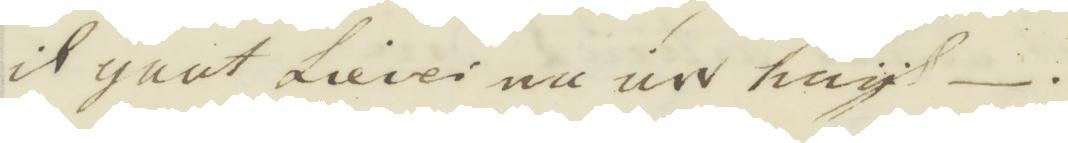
is gaat Liever na uw huijs —.
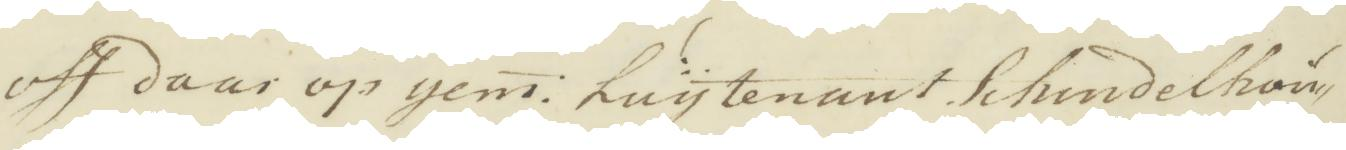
off daar op gem: Luijtenant schindelhou„
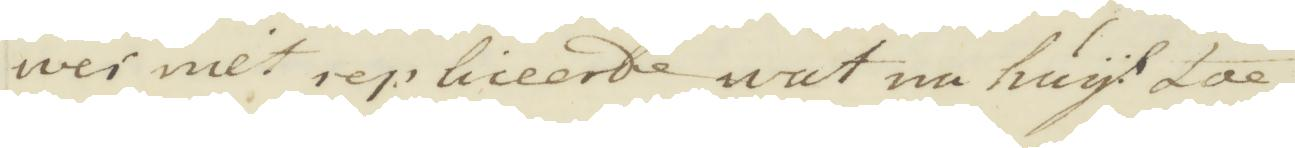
wer niet repliceerde wat na huijs toe
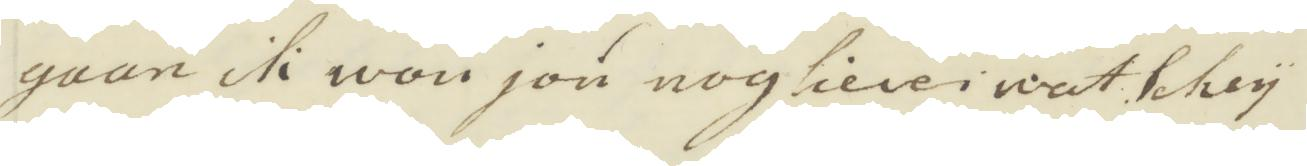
gaan ik wou jou nog liever wat scheij
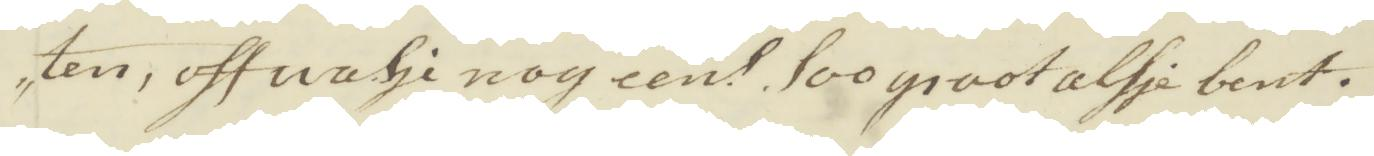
„ten, off wasje nog eens soo groot alsje bent.
